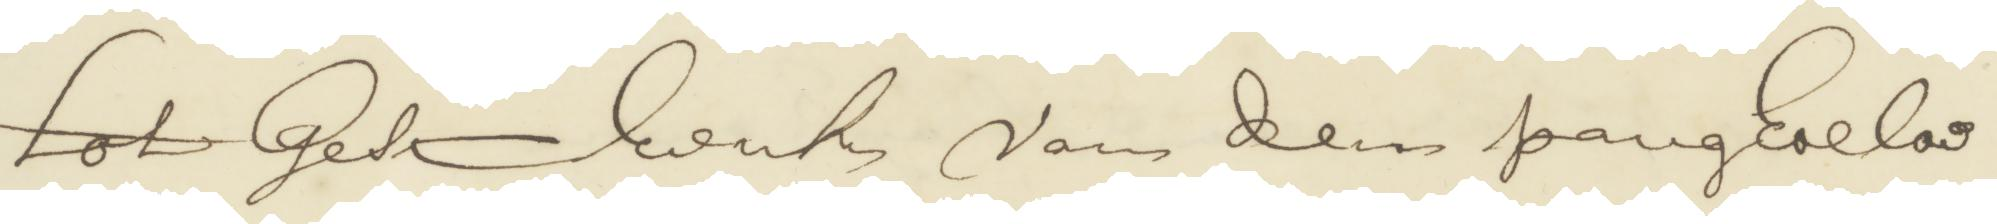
tot Geschenk van den panghoeloe
